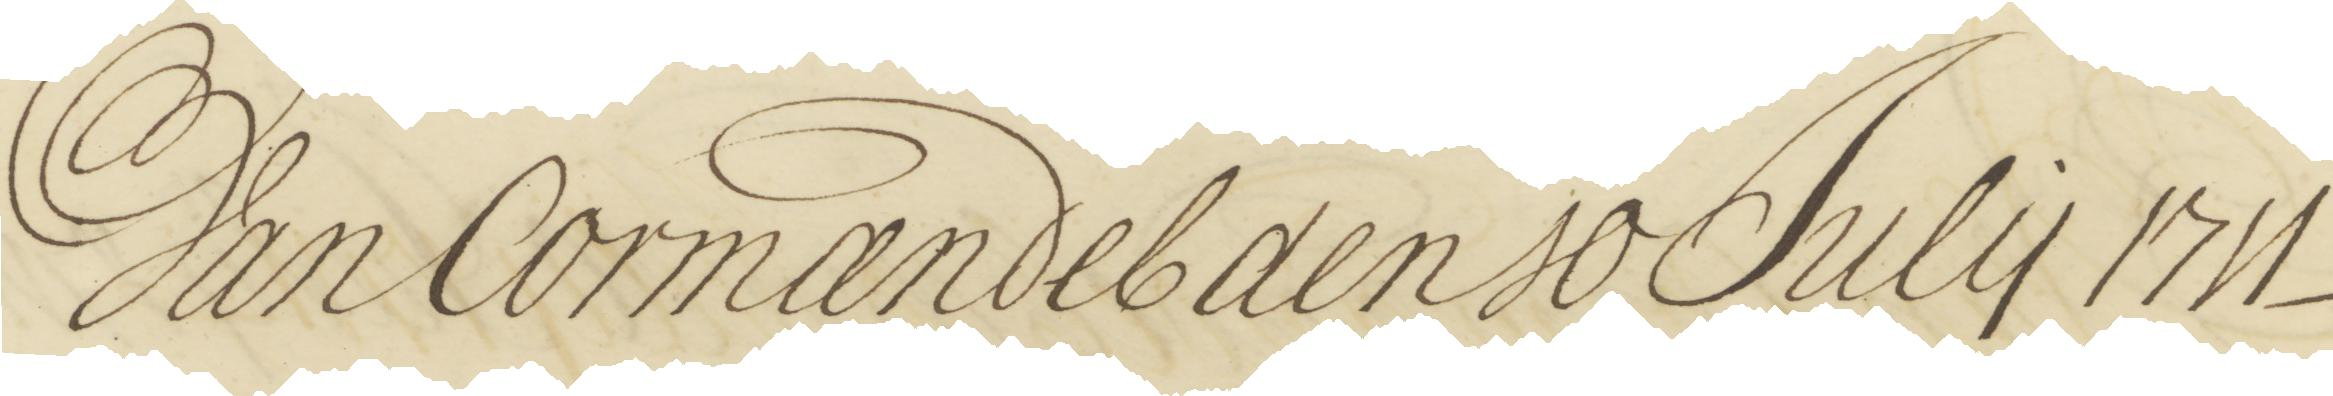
Van Cormandel den 10 Iulij 1711
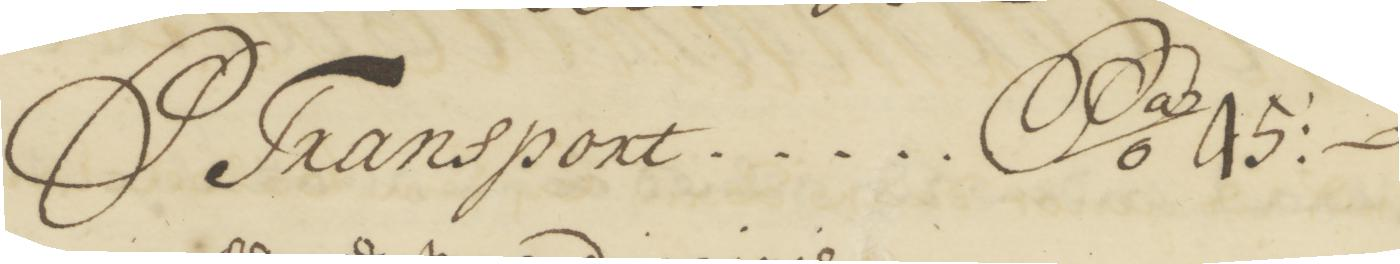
P Transport - - - - - P a/o 45:—
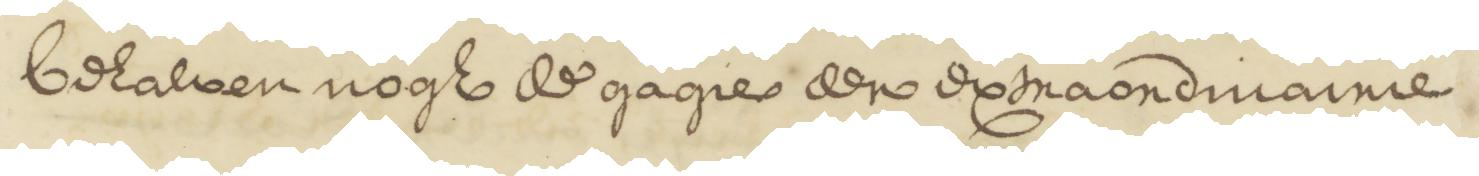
behalven nogh de gagies der extraordinairie
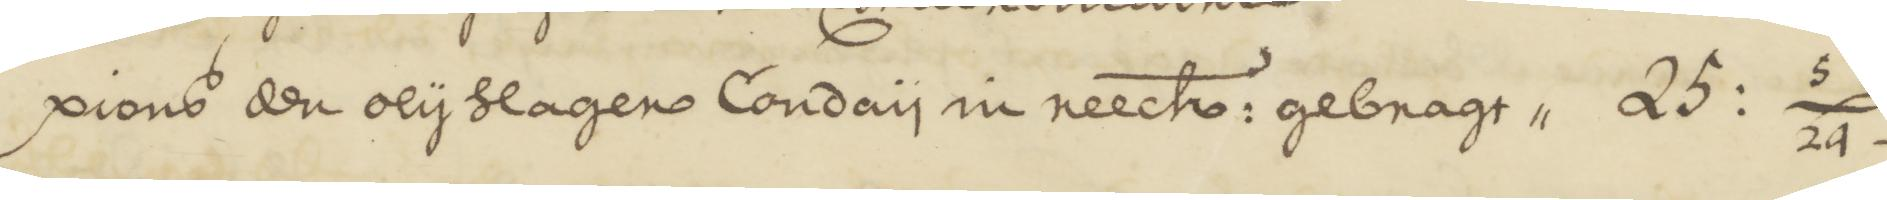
pions den olijslager Condaij in reeck: gebragt „ 25: 5/24
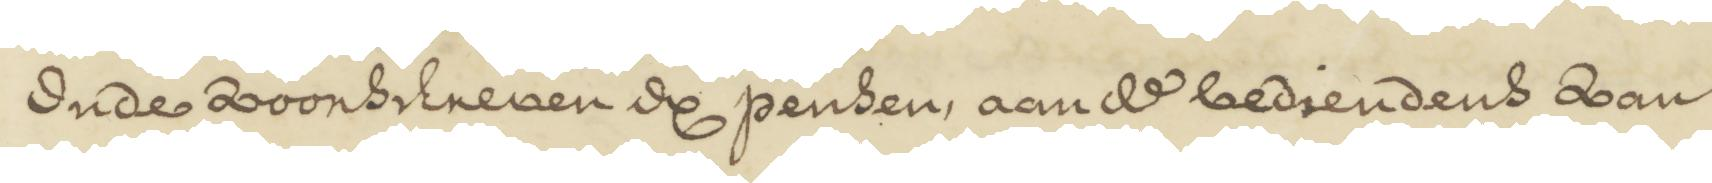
Ende voorschreven ex pensen, aan de bediendens van
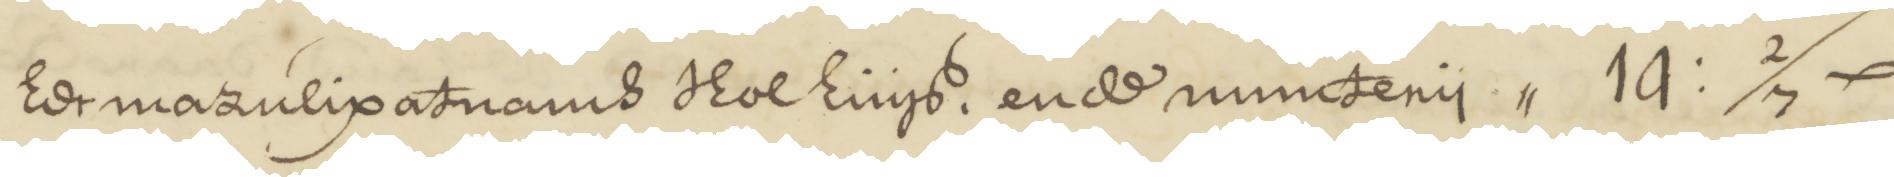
het mazulipatnams thol huijs, en de munterij „ 14: 2/7
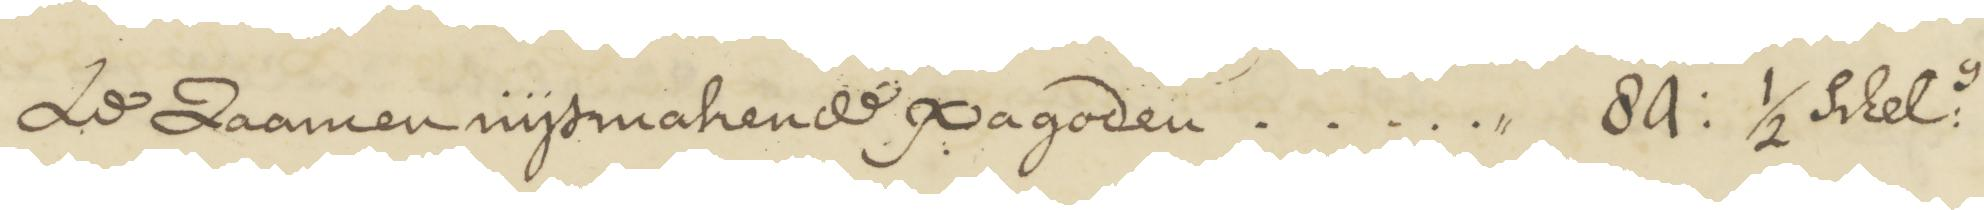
te zaamen uijtmakende pagoden - - - - - „ 84: ½ schel:g
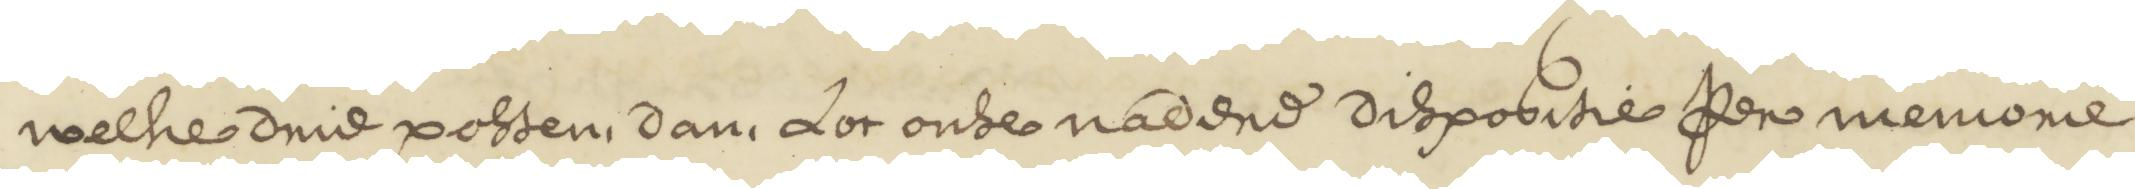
welke drie posten, dan, tot onse nadere dispositie per memorie
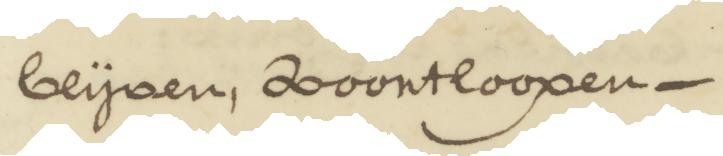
blijven, voortloopen —
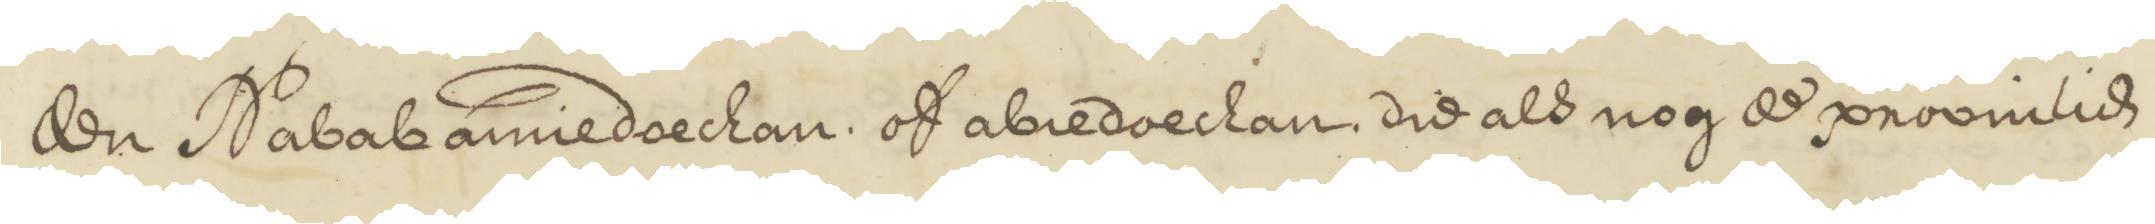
den Nababamiedoechan, of abiedoechan die als nog de provintien
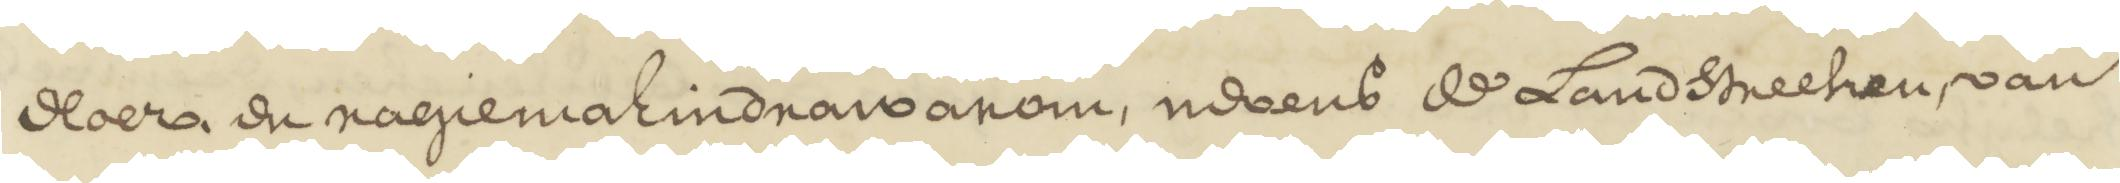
woer en ragiemahindrawarom, nevens de Landstreeken, van
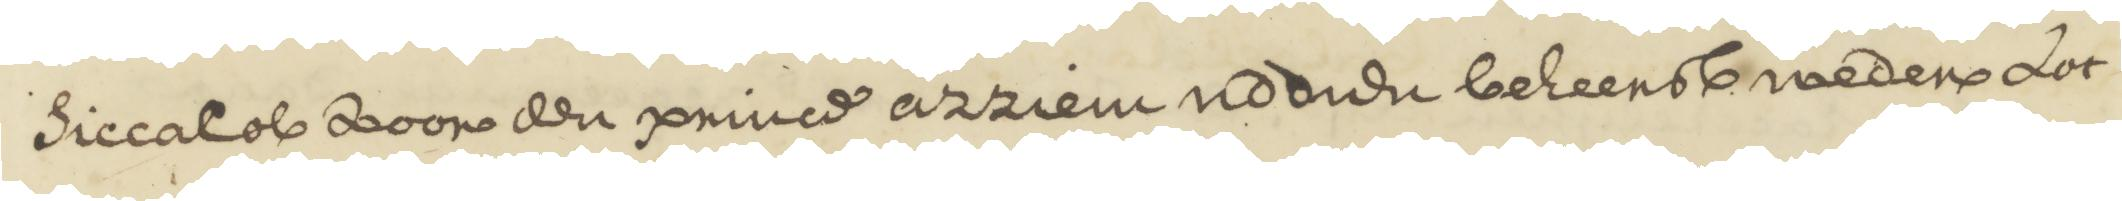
SiccaCol voor den prince azziem nddien beheerst weder tot
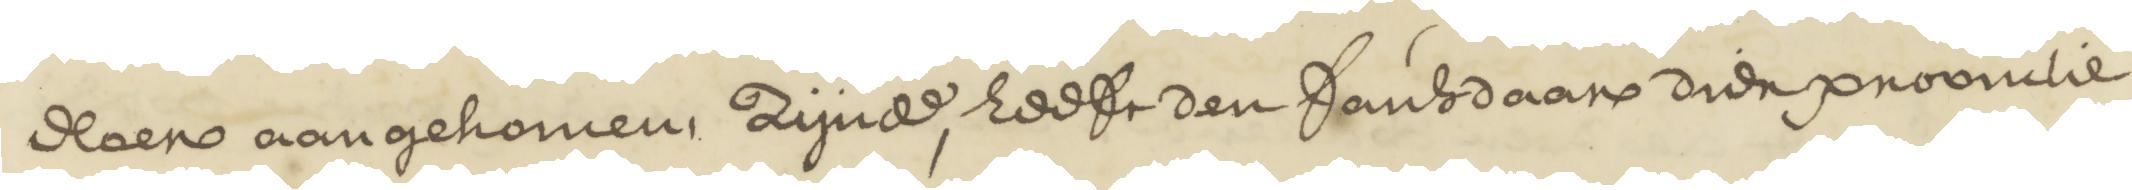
woer aan gekomen, zijnde, heeft den fausdaar dier provintie
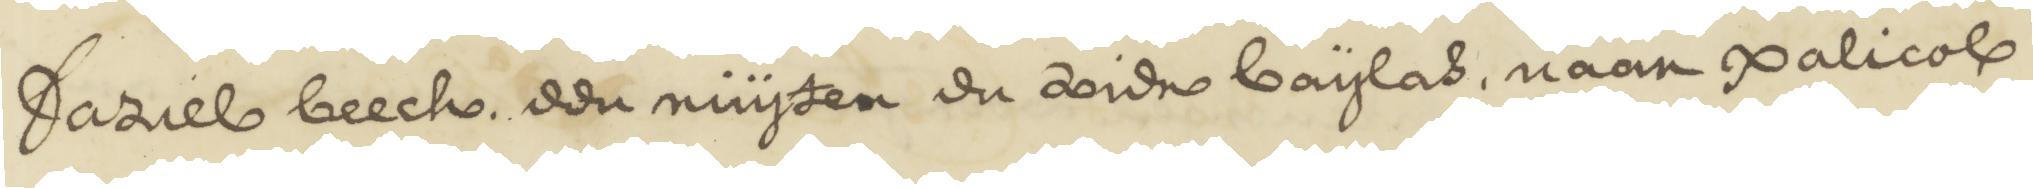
faziel beeck een ruijten en vier baijlas, naar palicol
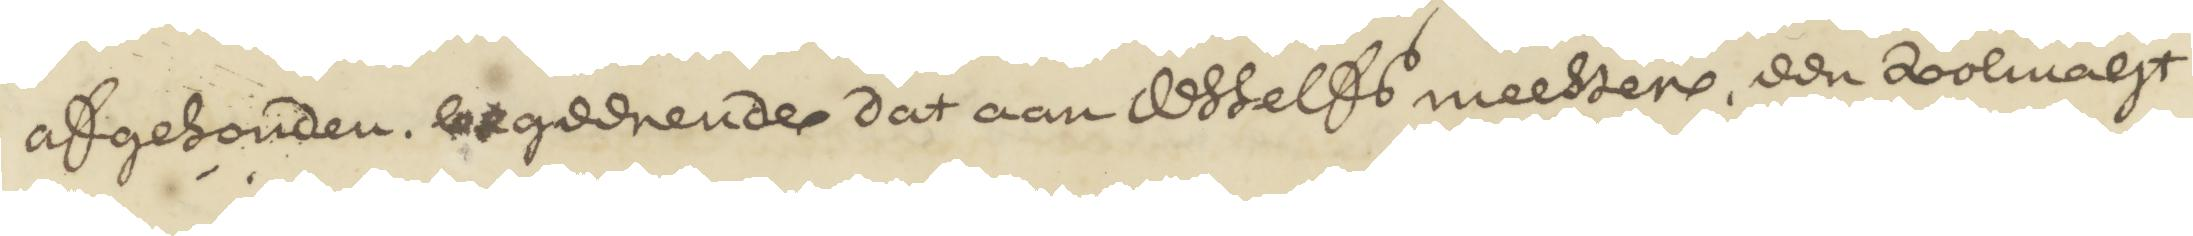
afgesonden begeerende dat aan desselfs meester, een volmagt
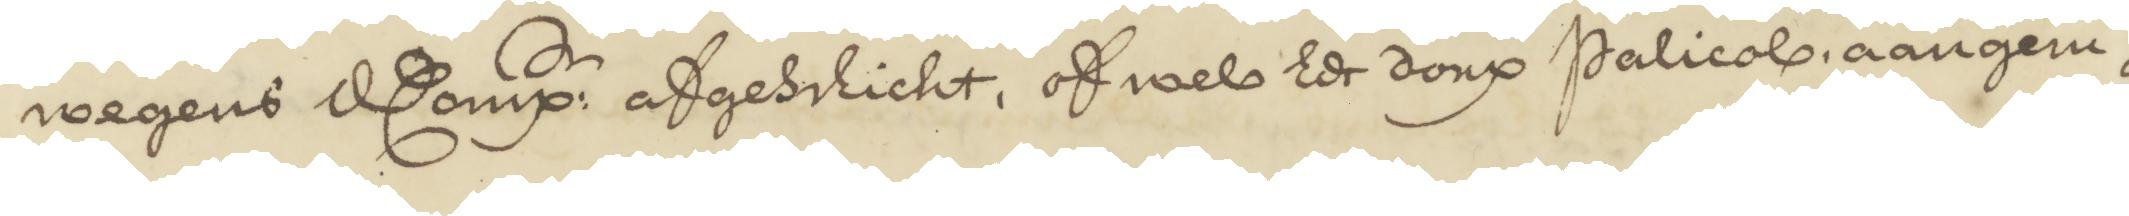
wegens EComp:s afgeschickt, of wel het dorp Palicol, aangem
